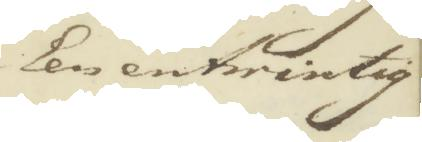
Een en twintig
